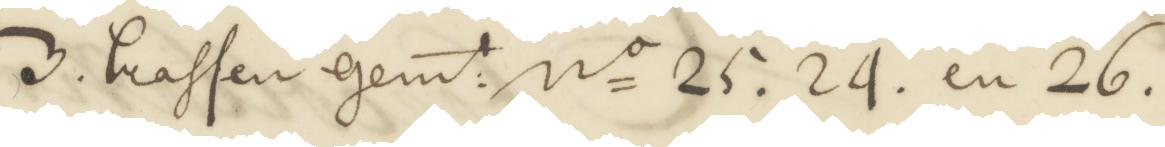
3. kassen gem:t n=o 25. 24. en 26.
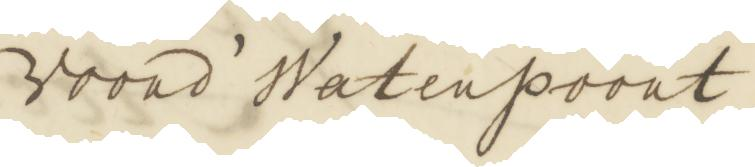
Voord’ waterpoort
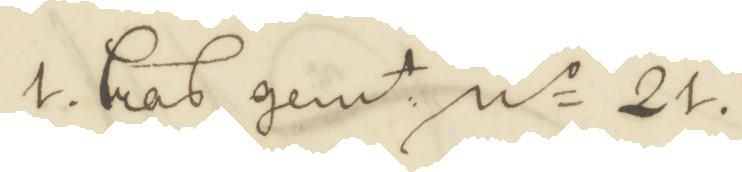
1. kas gem:t n=o 21.
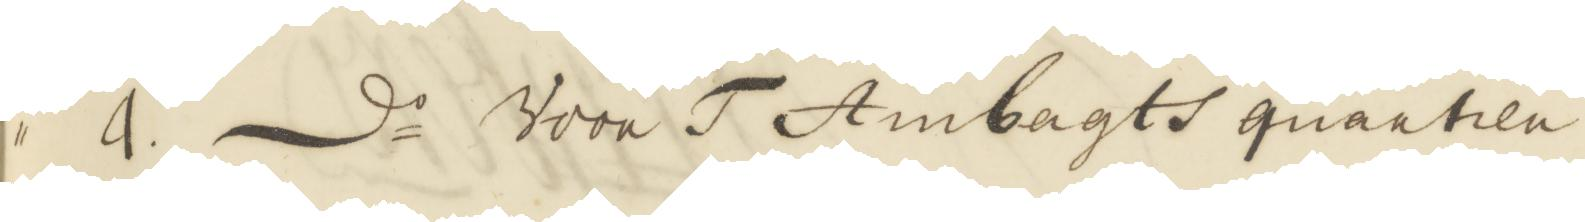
„ 4'. D=o Voor 'T Ambagts quartien
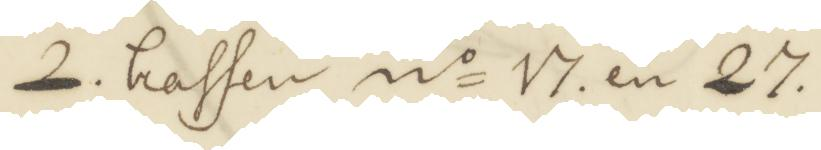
2. kassen n=o 17. en 27.
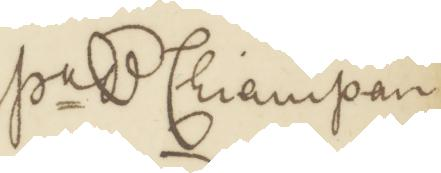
P=r de Chiampan
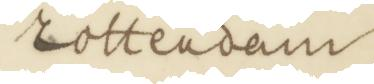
rotterdam
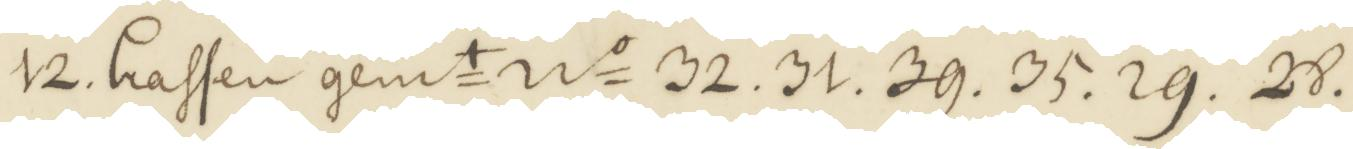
12. kassen gem=t n=o 32. 31. 39. 35. 29. 28.
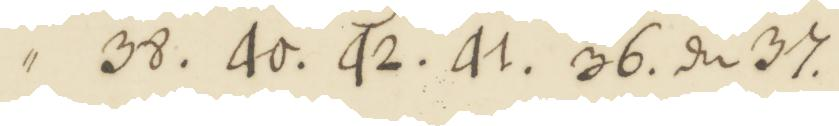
„ 38. 40. 42. 41. 56. en 37.
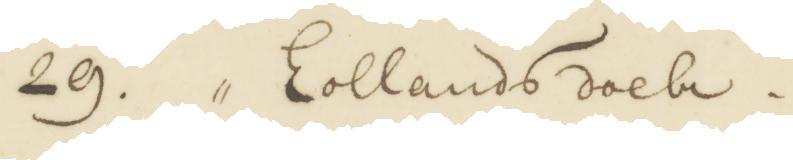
29. „ Hollands doek.
